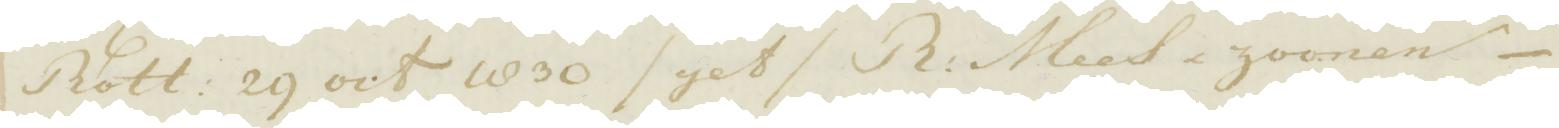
Rott: 29 oct 1830 /get/ R: Mees & zoonen
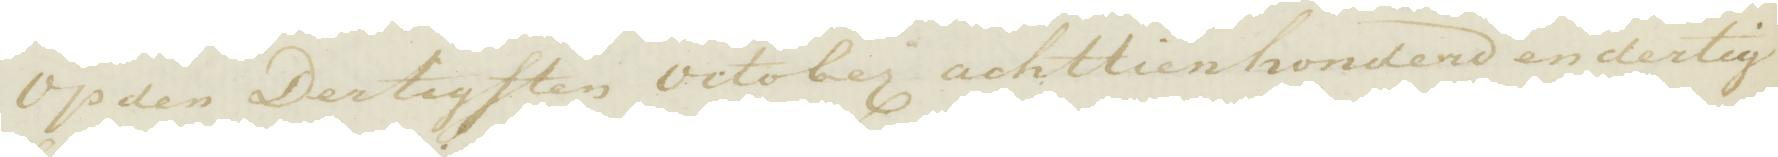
Op den Dertigsten October achttienhonderd en dertig
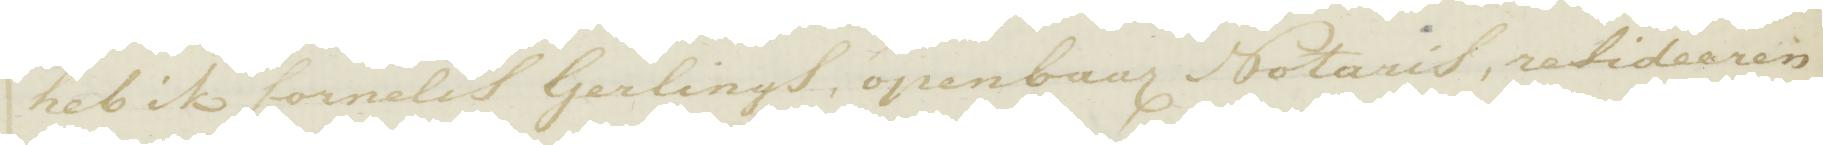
heb ik Cornelis Gerlings, openbaar Notaris, resideeren
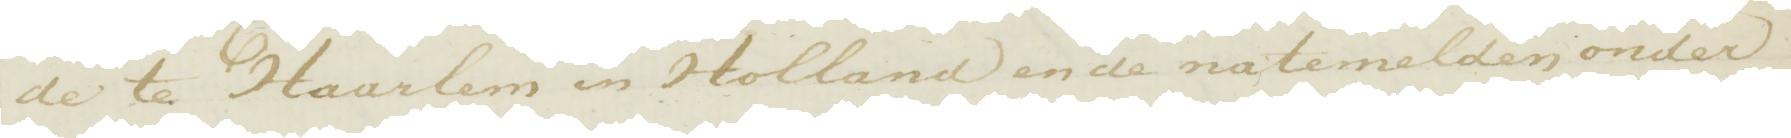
de te Haarlem in Holland en de natemelden onder
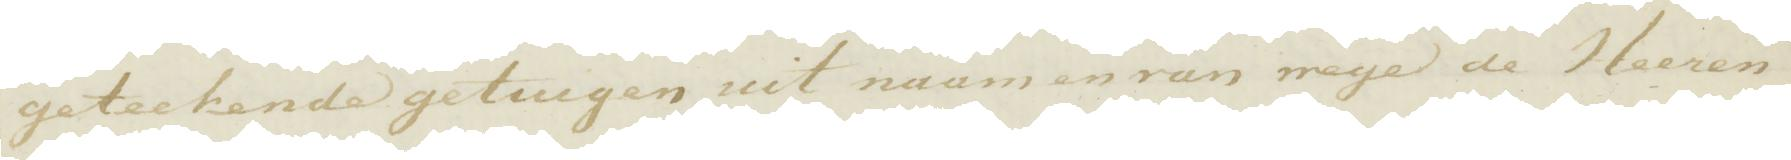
geteekende getuigen uit naam en van wege de Heeren
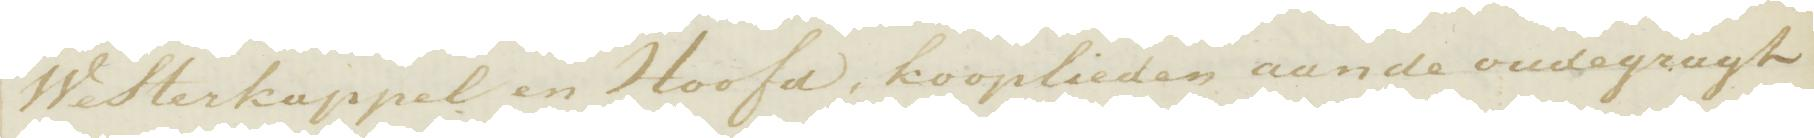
Westerkappel en Hoofd, kooplieden aan de oudegragt
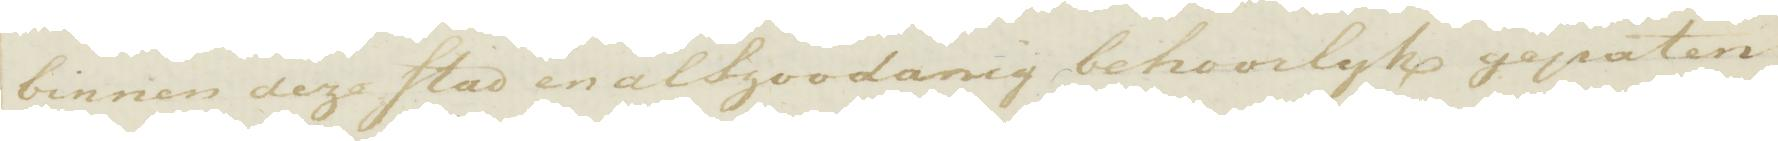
binnen deze stad en als zoodanig, behoorlyk gepaten
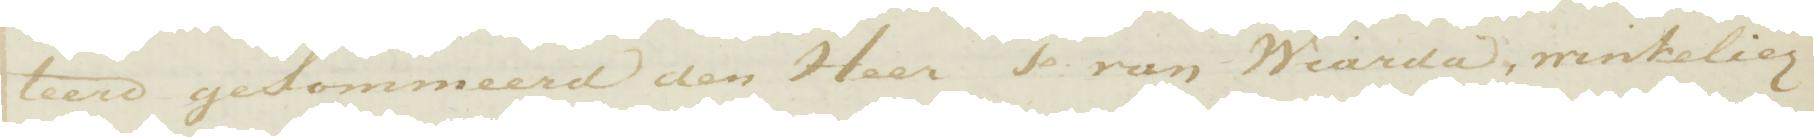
teerd gesommeerd den Heer F: van Wiarda, winkelier
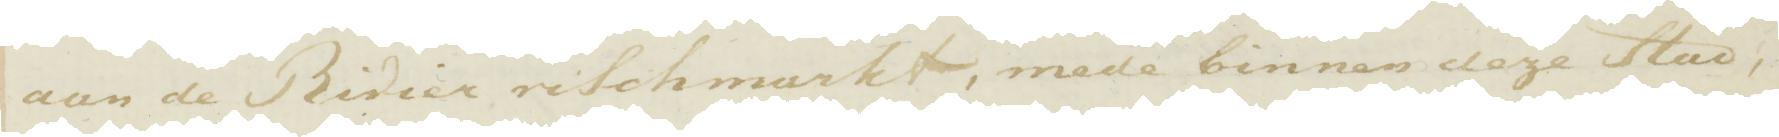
aan de Rivier vischmarkt, mede binnen deze stad,
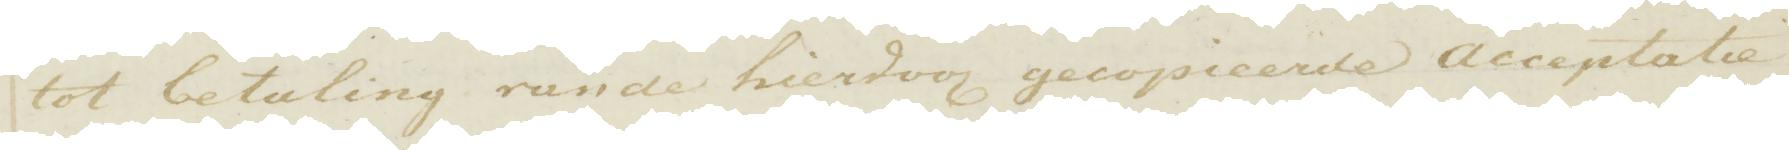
tot betaling van de hiervoor gecopieerde Acceptatie
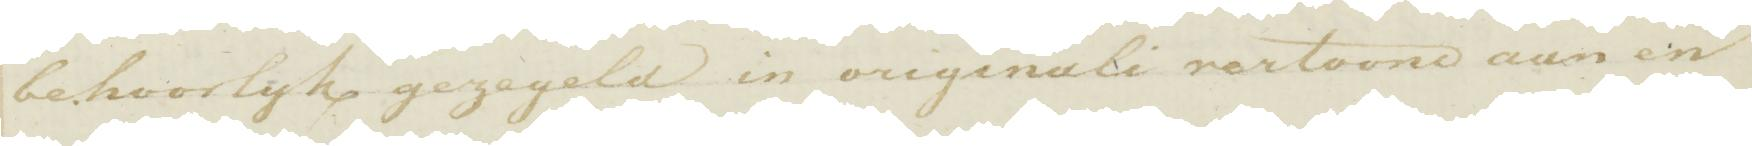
behoorlijk gezegeld in originali vertoond aan en
